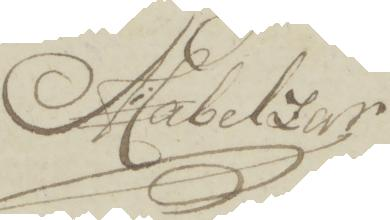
A: Cabelzar
